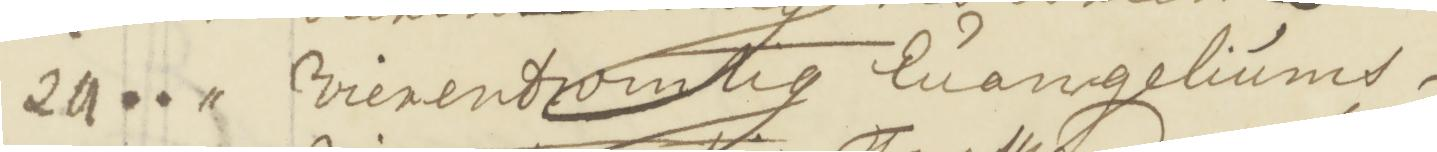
24 . . „ vierentwintig Euangeliums
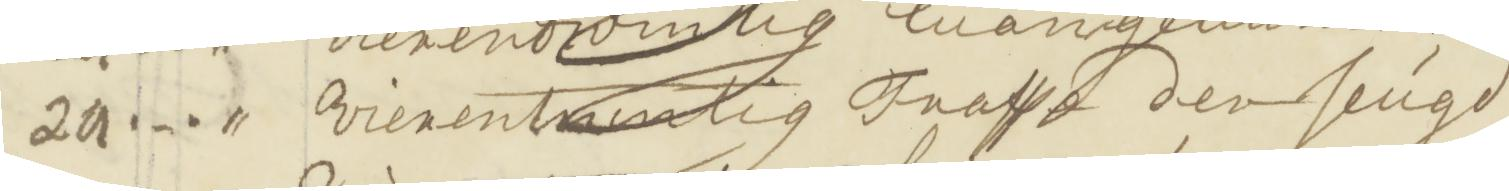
24. —. „ vierentwintig Trappe der Jeugd
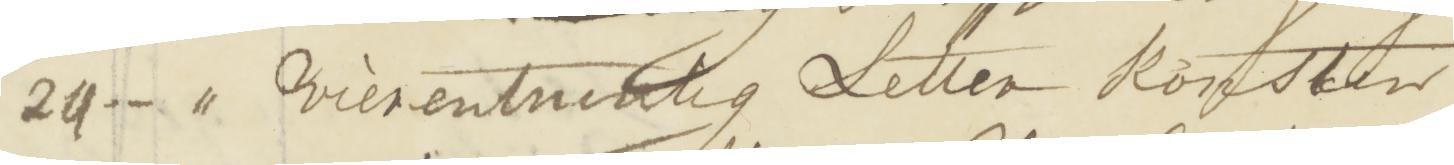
24. — „ vierentwintig Letter konsten
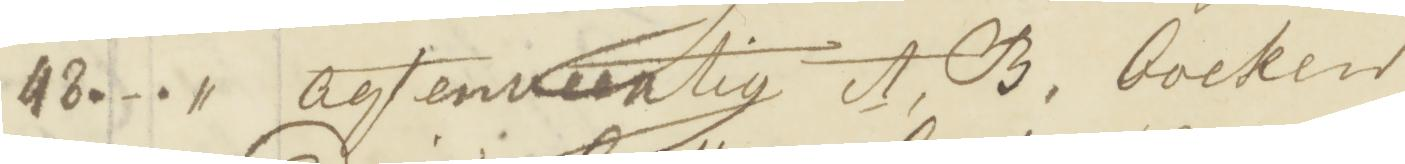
48. —. „ agtenwintig A, B, boeken
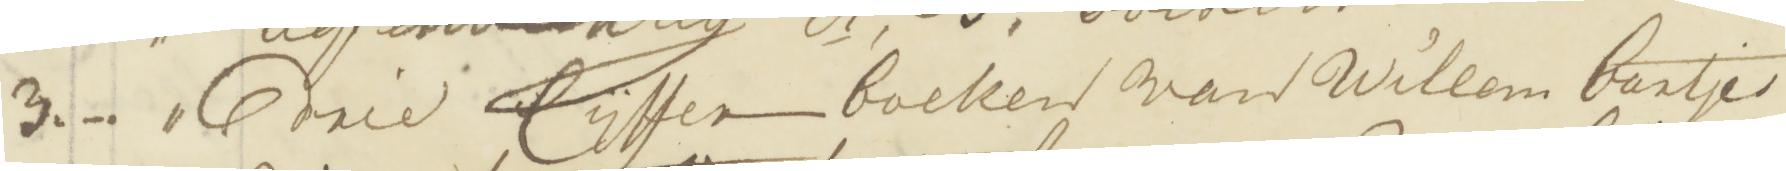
3. —. „ drie Cijffer boeken van Willem bartjes
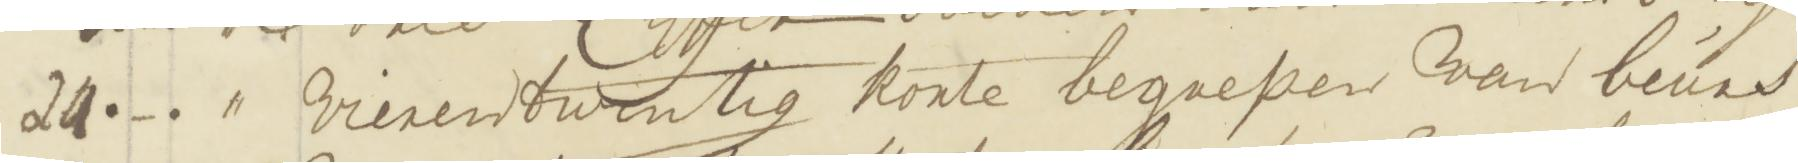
24. —. „ vierentwintig korte begrepen van beurs
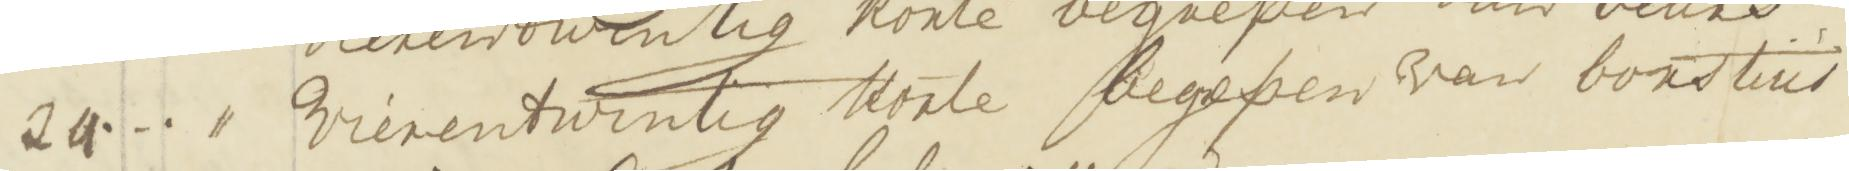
24. —. „ vierentwintig korte begrepen van borstius
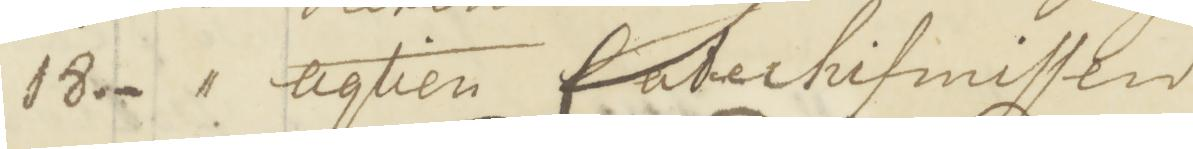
18. — „ agtien Catechismissen
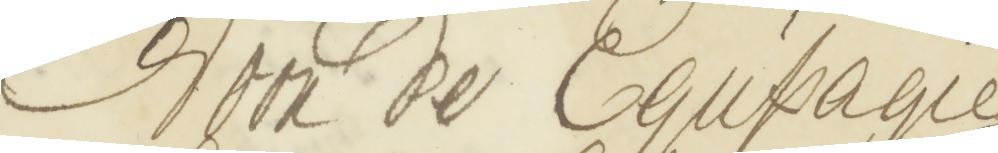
Voor de Equpagie
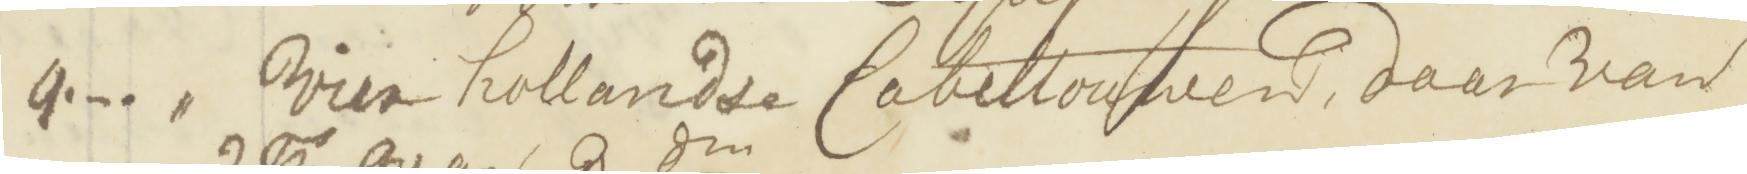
4. —. „ vier hollandse Cabeltouwen, daar van
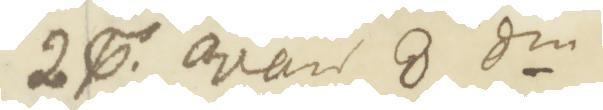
2 p.s van 8 d=m
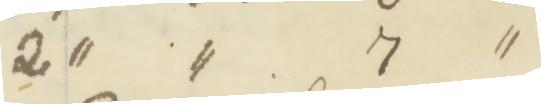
2 „ „ 7 „
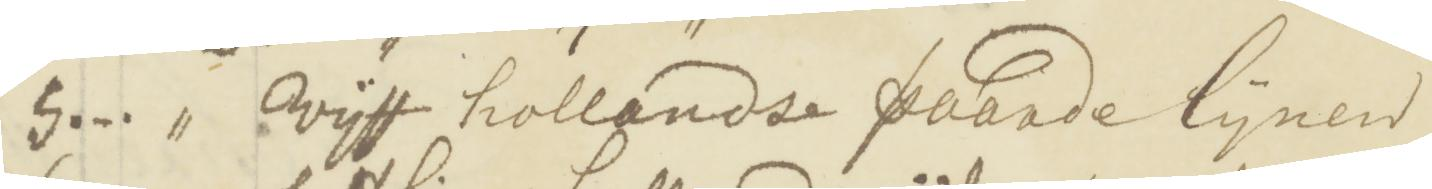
5. —. „ vijff hollandse paarde lijnen
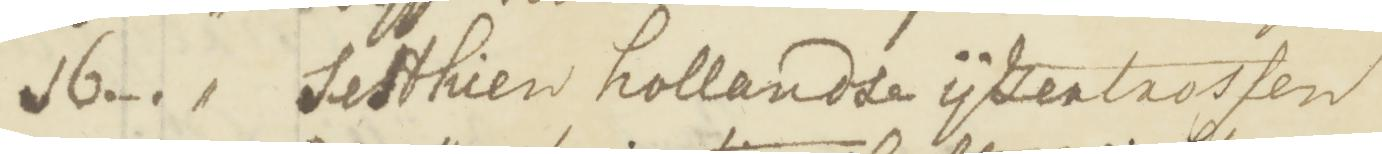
16. —. „ sesthien hollandse ijzertrossen
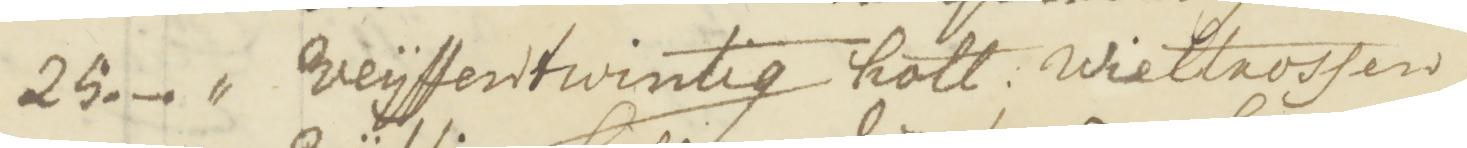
25. —. „ veijffentwintig holl: wieltrossen
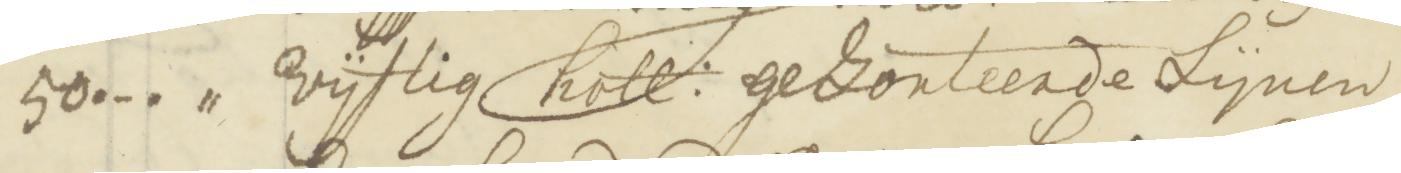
50. —. „ vijftig holl: gezorteerde Lijnen
